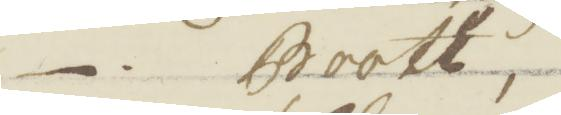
—. Booth,
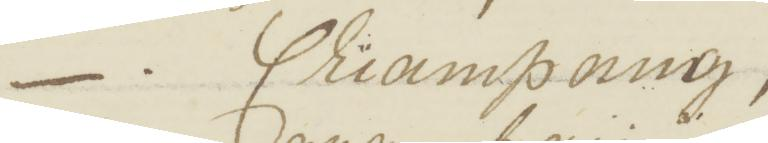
—. Chiampang,
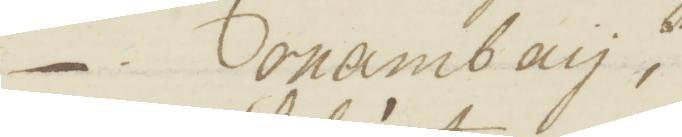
—. orambaij,
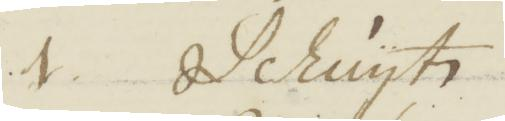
1. schuijt
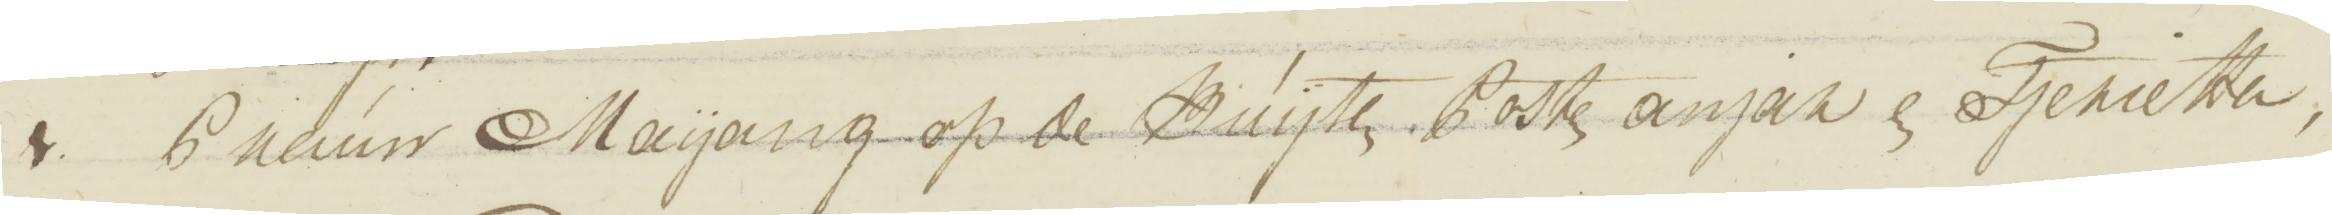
1. brauw Maijang op de Buijten. Posten anjar en Tjerietta,
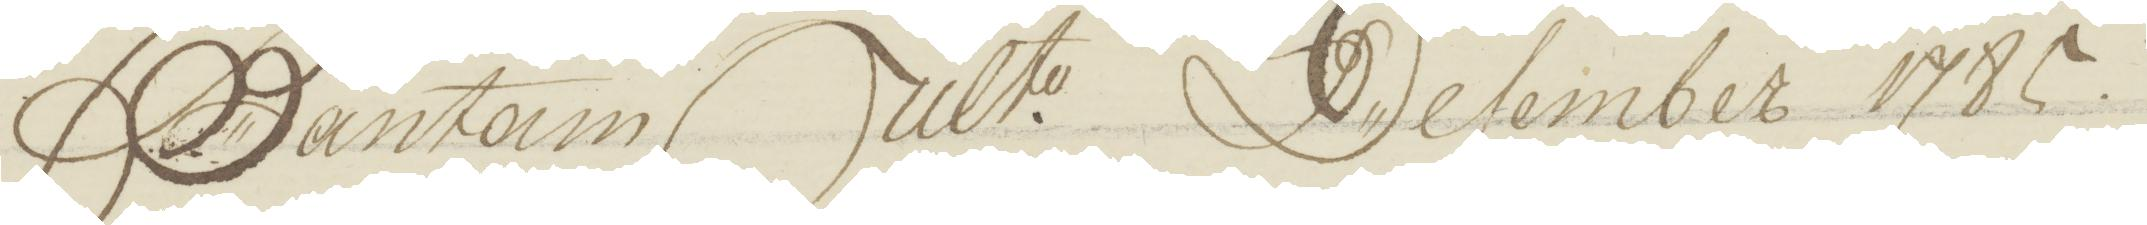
Bantam ult.o December 1785.
